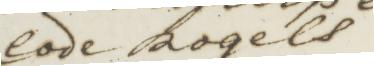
lode kogels
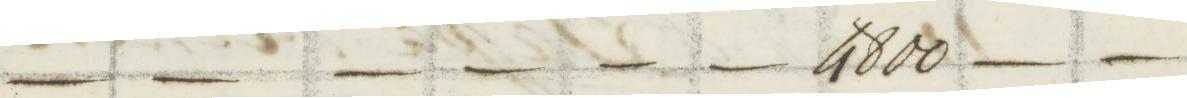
— — — — — — 4800 — —
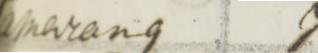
amarang 7
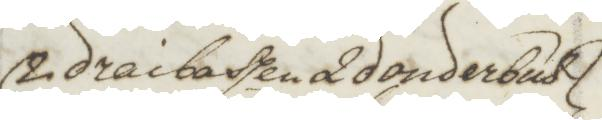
2 draibassen 2 donderbus
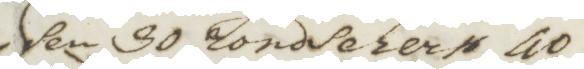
sen 30 rondscherp 40
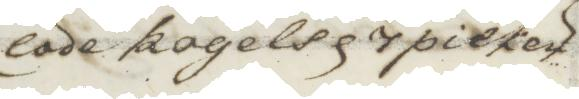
lode kogels en 7 pieken
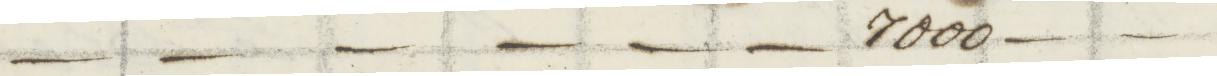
— — — — — — 7000 — —
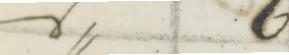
_„o 6
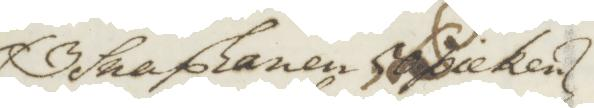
3 snaphanen 50 pieken
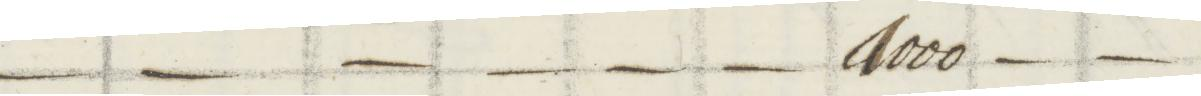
— — — — — — 4000 — —
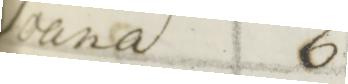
oana 6
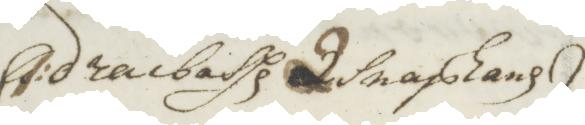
4: draibassen 2 snaphanen
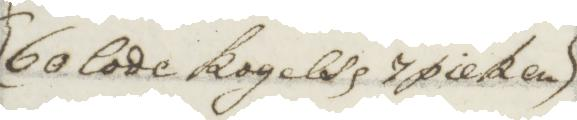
60 lode kogels en 7 pieken
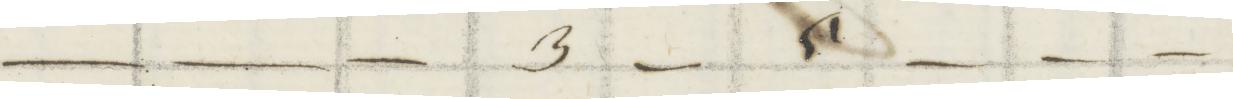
— — — 3 — 5 — — —
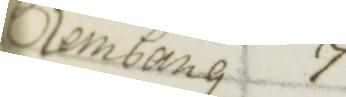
Rembang 7
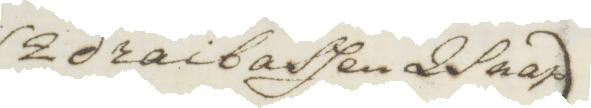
2 draibassen 2 snap
